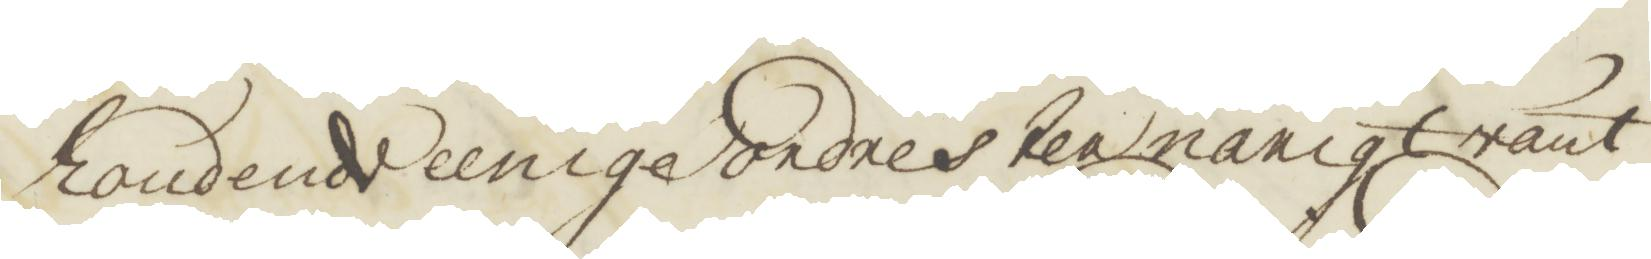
houdende eenige ordres ter narigt van’t
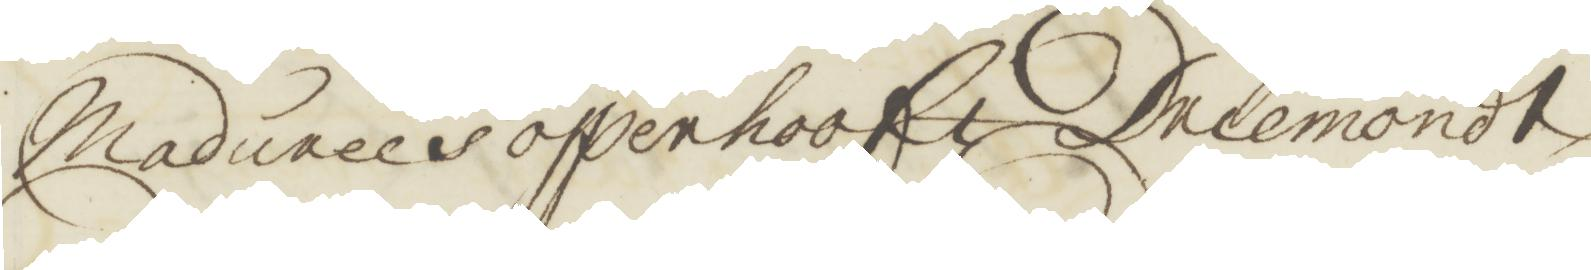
Madurees opperhooft Driemondt,
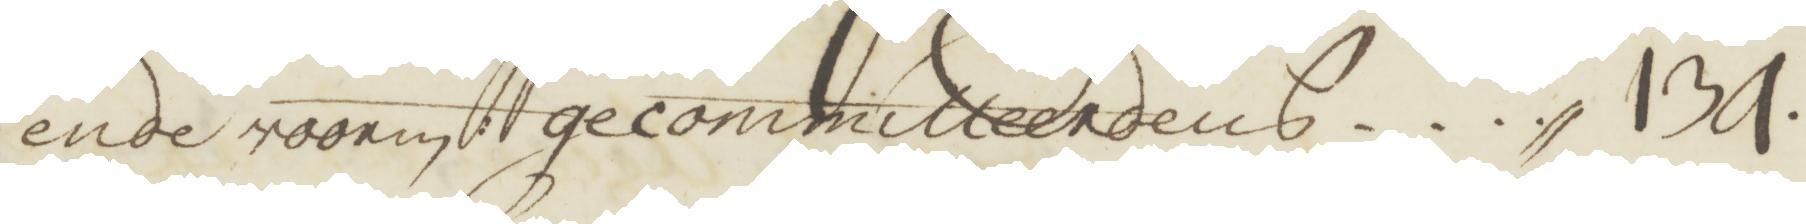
ende voorm: 't gecommitteerdens -. . . „ 134.
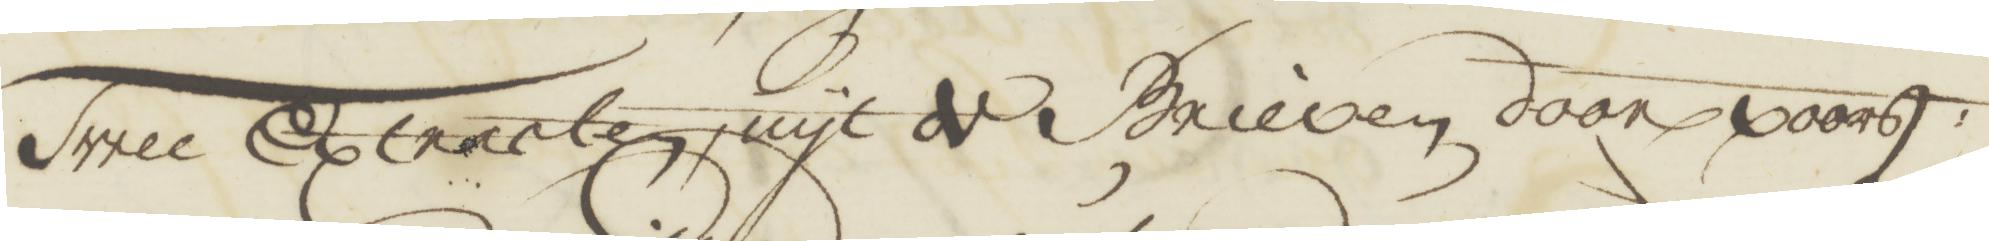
Twee Extracten, uijt de Brieven door voors:
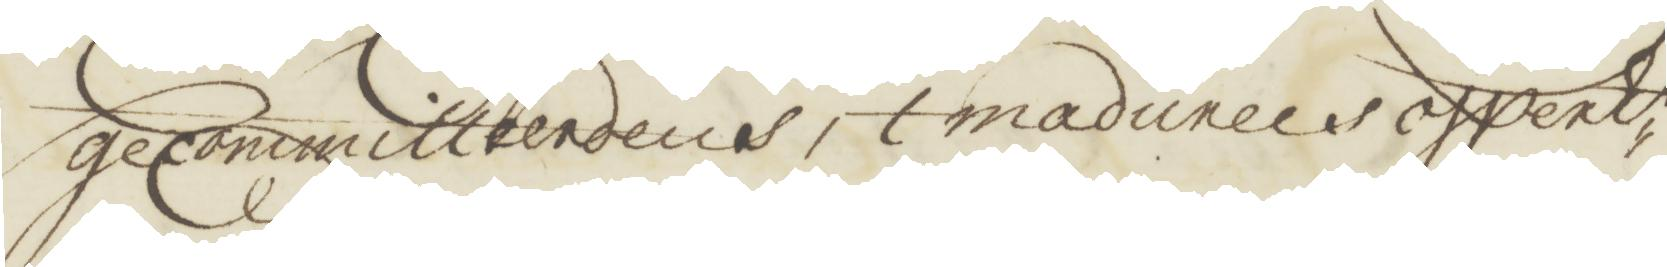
gecommitteerdens, ’t madurees opperh„t
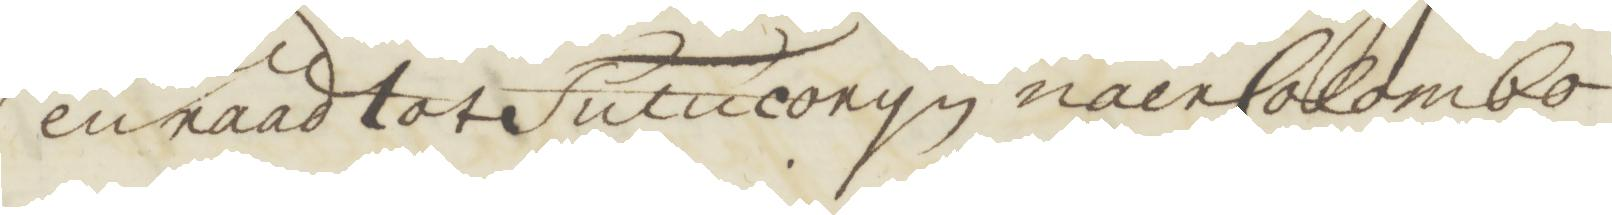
en raad tot Tutucorijn naer Colombo
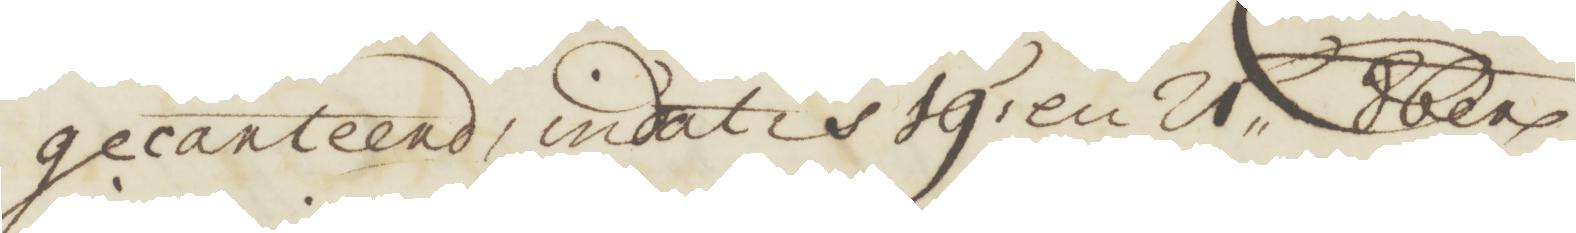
gecarteerd, indatis 19:' en 21„' 8ber
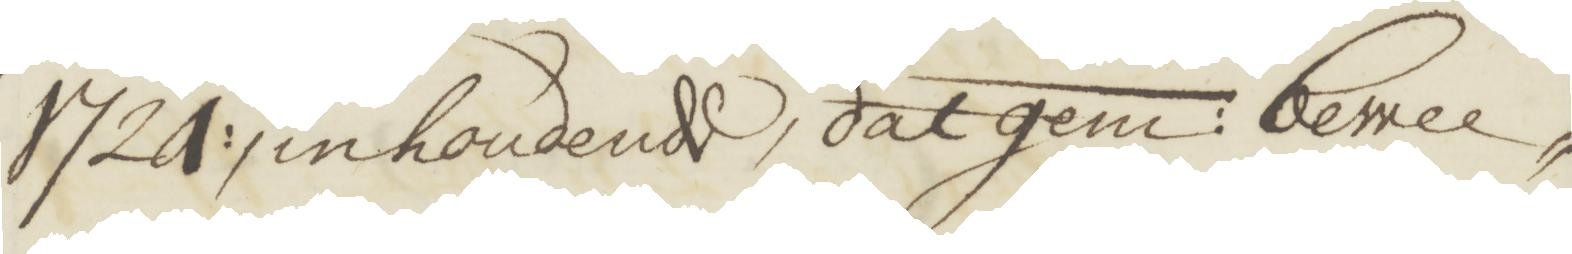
1724:, inhoudende, dat gem: bewee„
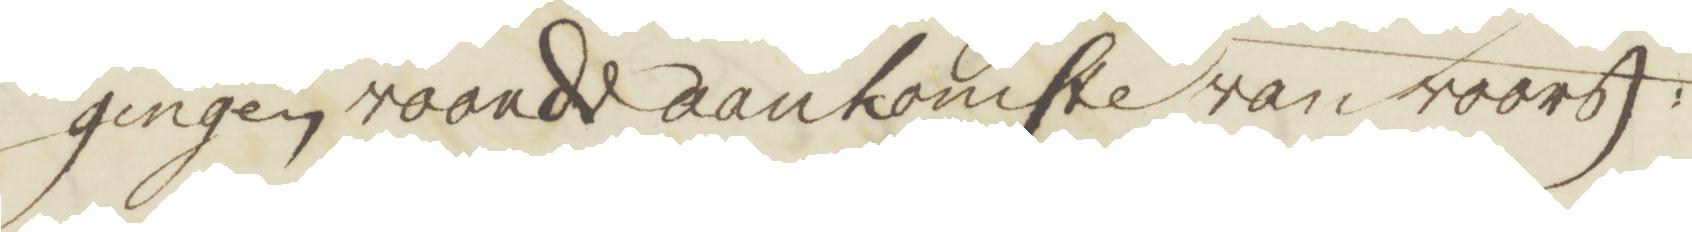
gingen voorde aankomste van voorsz:
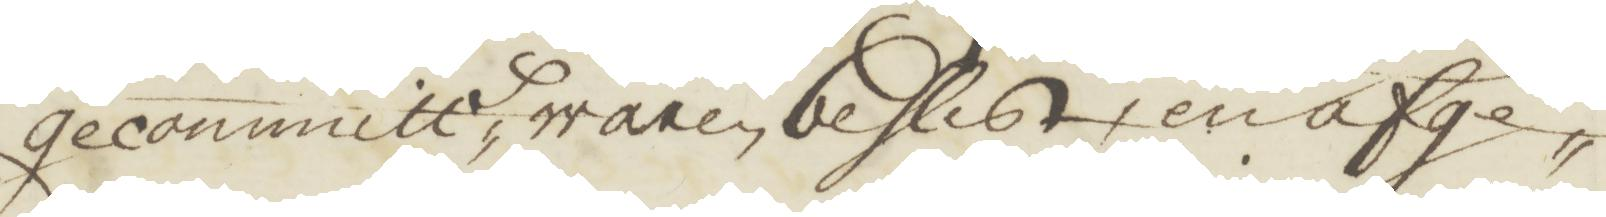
gecommitt„s waren beslist, en afge„
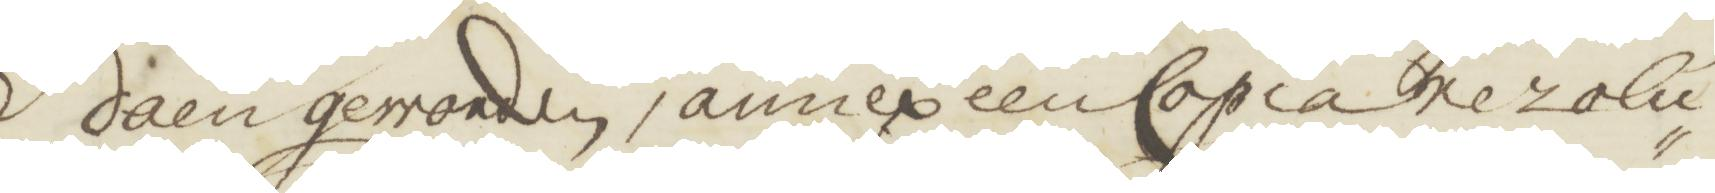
daen geworden, annex een Copia rezolu„
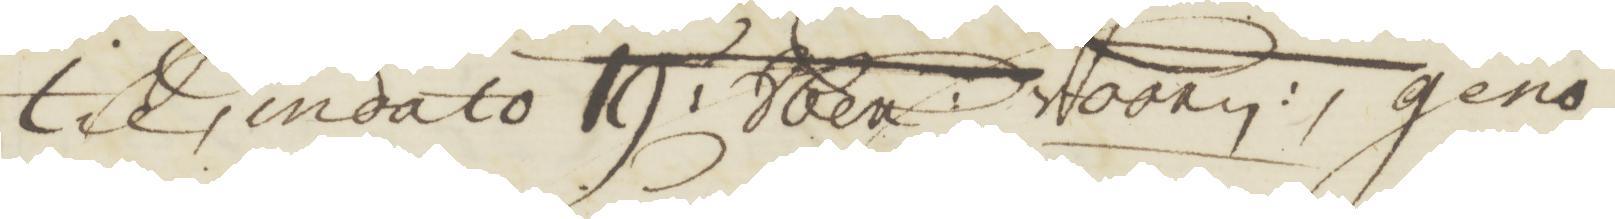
tie, in dato 19:' 8ber: voorn:, geno
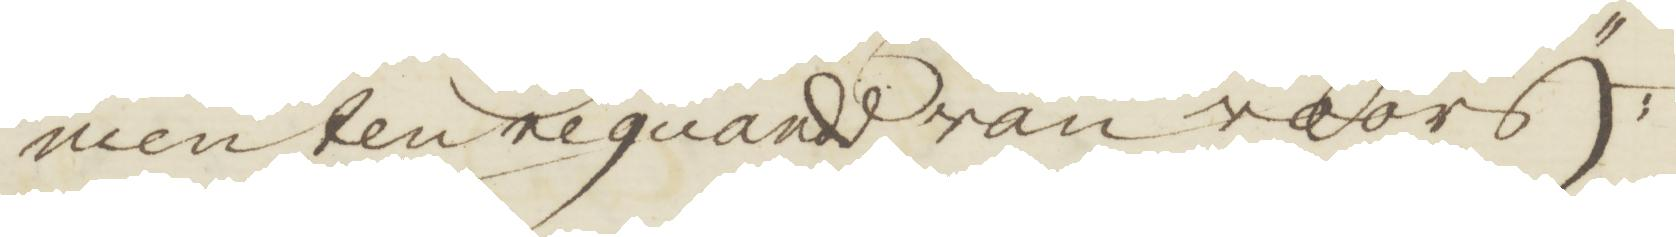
men ten reguarde van voors:
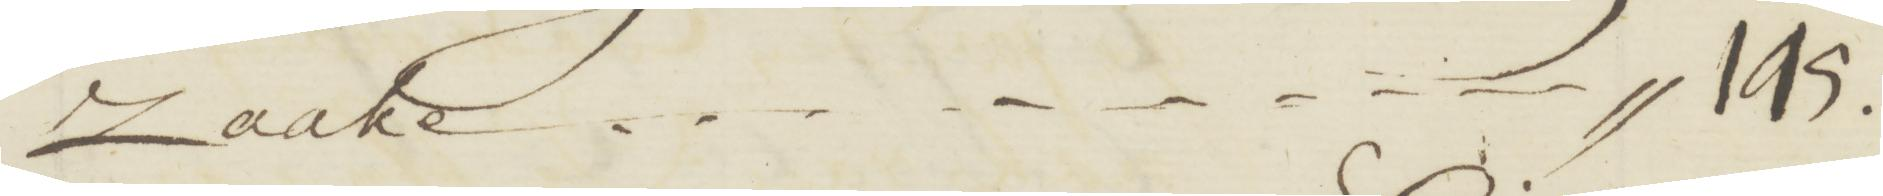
zaake . - - - - - - - - - „145.
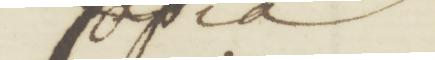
Copia:
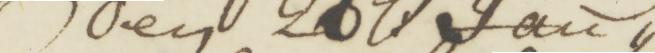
den 26: Ian„y
